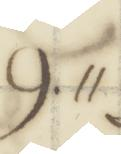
9. „
